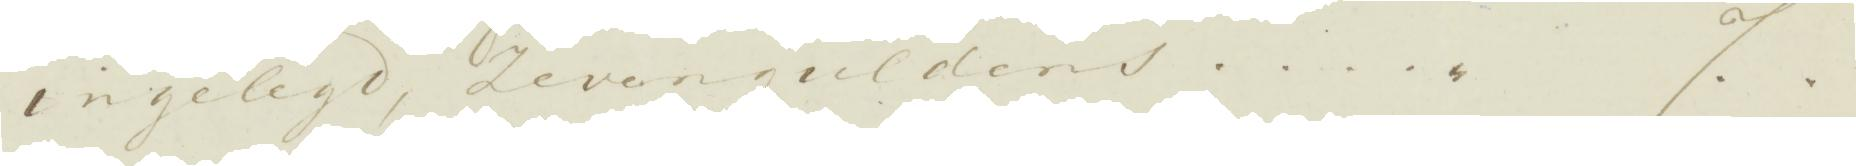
in gelegd, zeven guldens. . . . „ 7. „
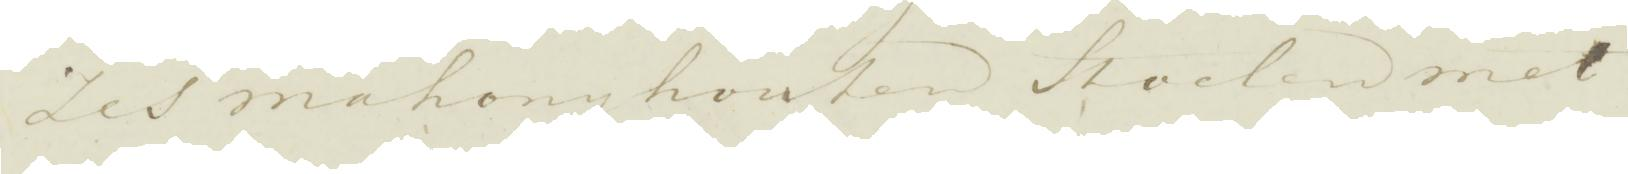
Zes mahonyhouten stoelen met
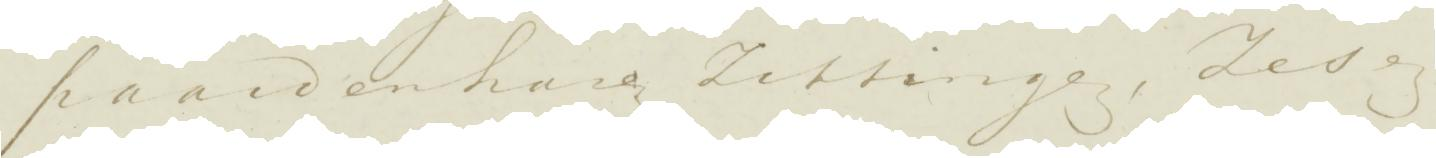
paardenharen Zittingen, Zes en
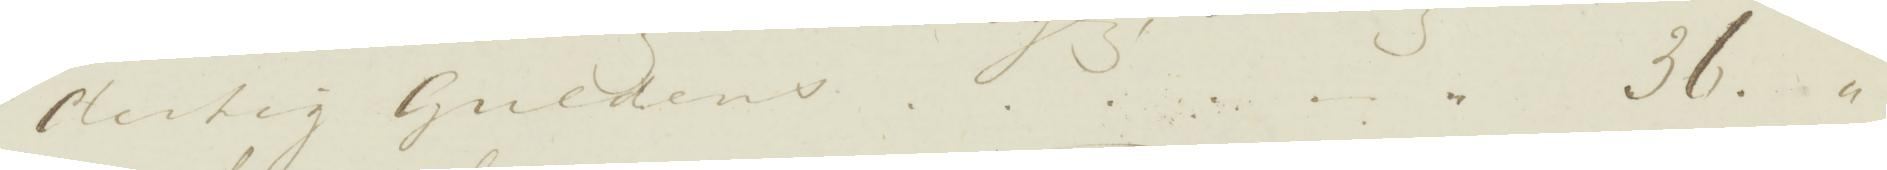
dertig Guldens . . . . . . „ 36. „
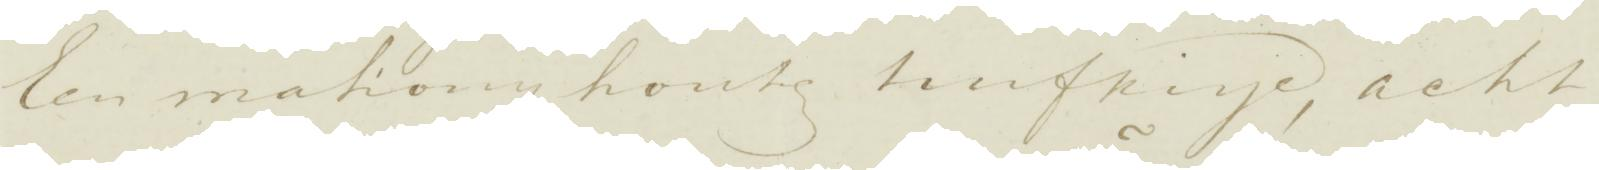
Een mahonyhouten turfkisje, acht
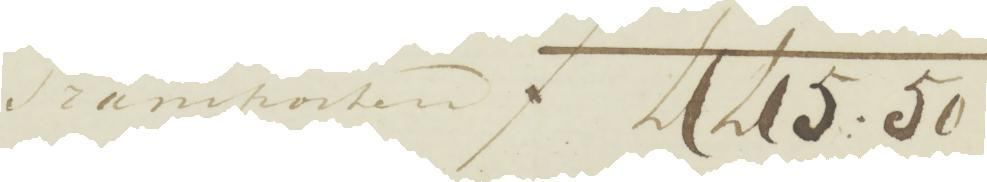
Transporten ƒ 445:50
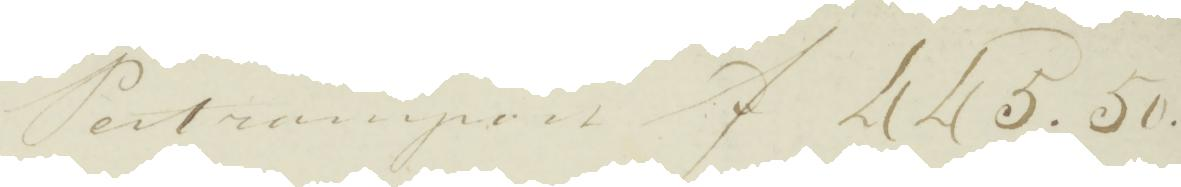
Pertransport ƒ 445.50
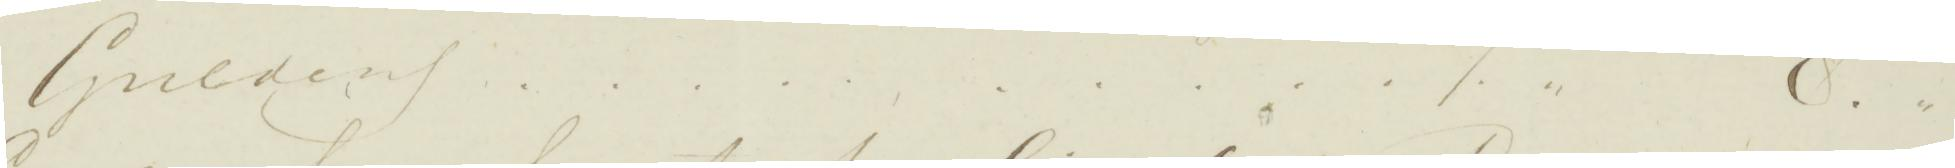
Guldens . . . . . . . . . . . . „ 8. „
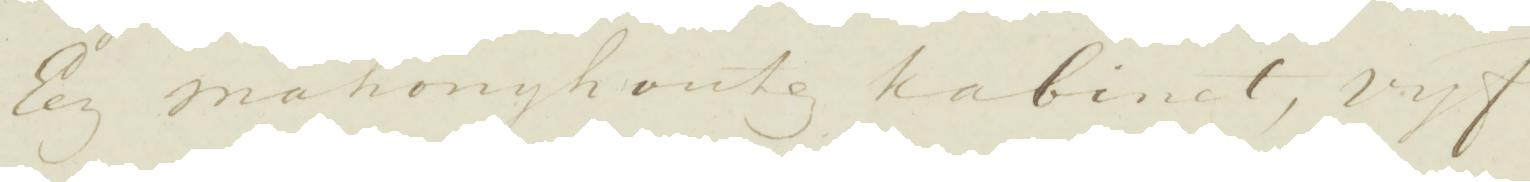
Een mahonyhouten kabinet, vyf
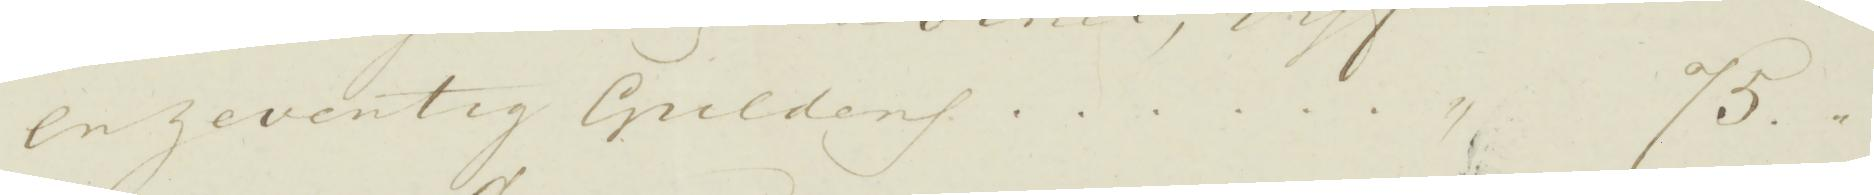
enzeventig Guldens. . . . . . . „ 75. „
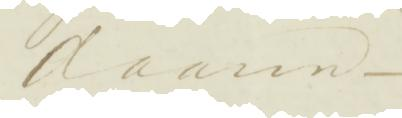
daarin -
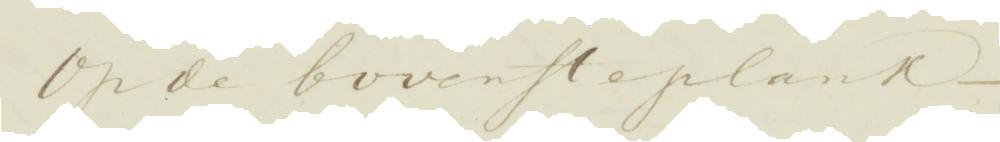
Op de bovensteplank
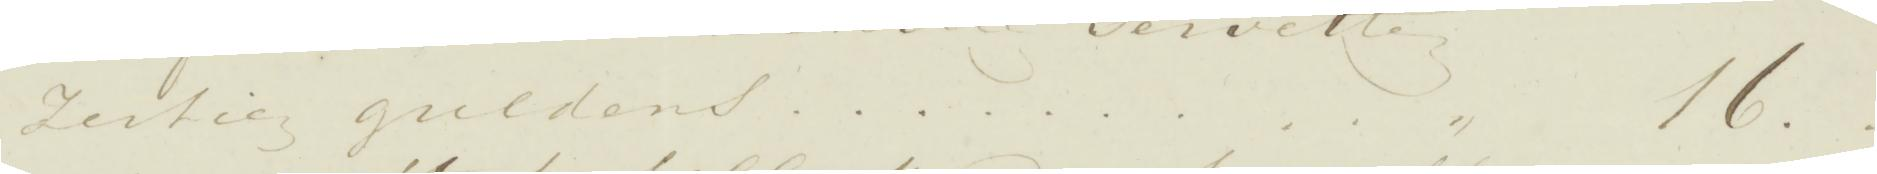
Zestien guldens . . . . . . . . . „ 16.
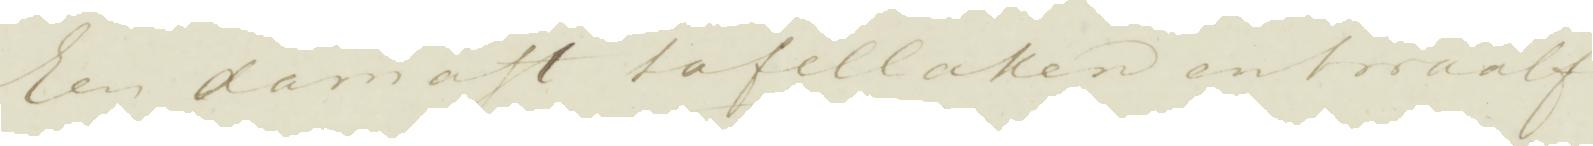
Een damast tafellaken en twaalf
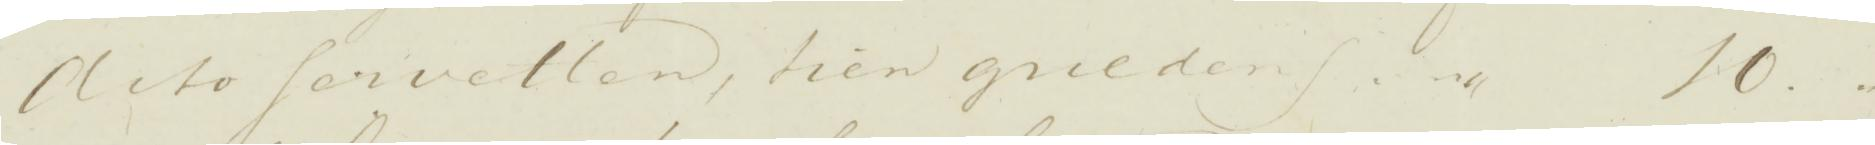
dito servetten, tien guldens . . „ 10. „
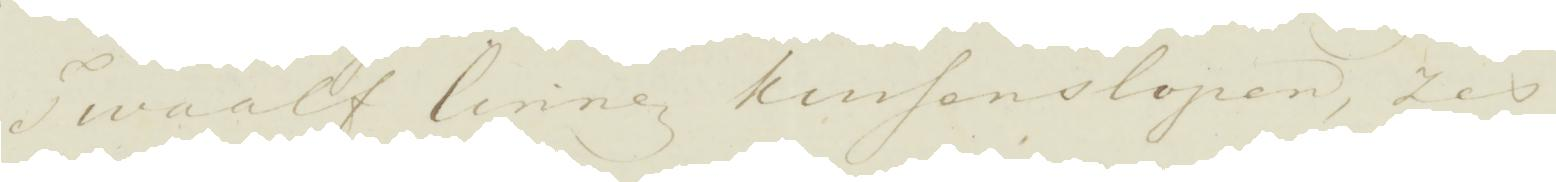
Twaalf linnen kussenslopen, zes
